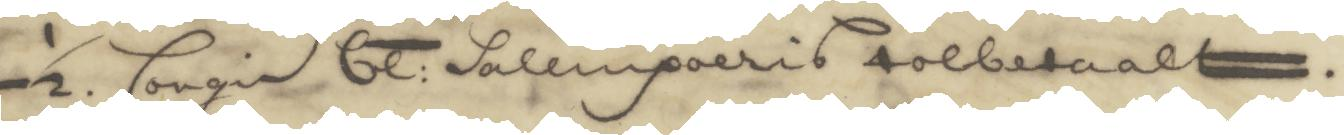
—½. Corgie bl: Salempoeris tol betaalt.
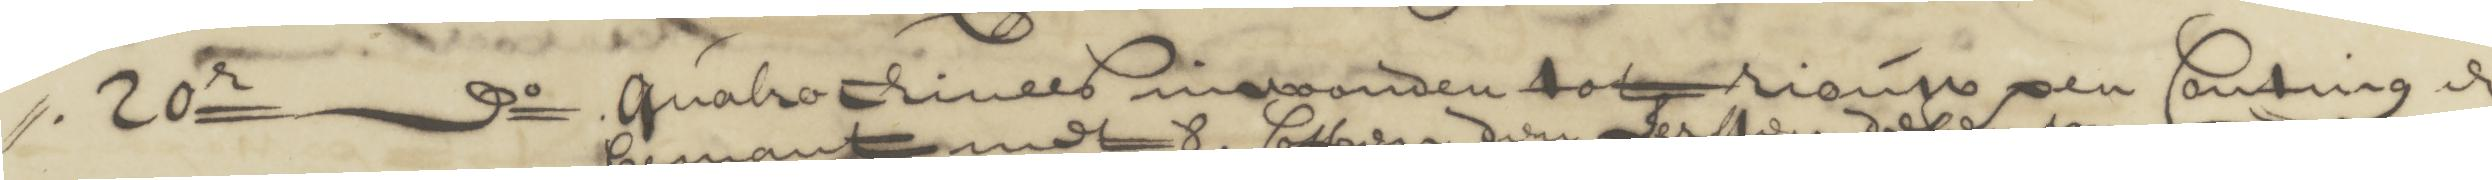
„. 20=en d=o. Quako chinees inwoonder tot Riouw per Conting en
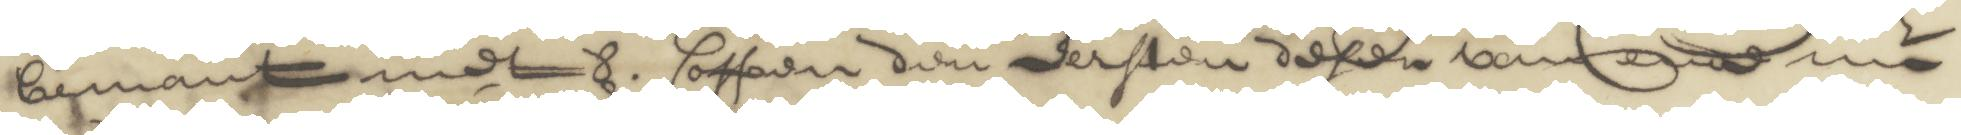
bemant met 8. Coppen den eersten desen van ende nu
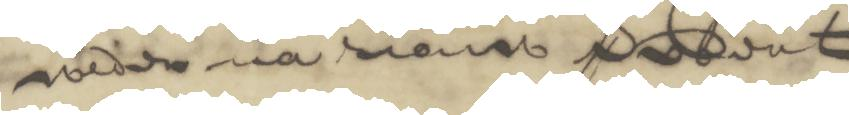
weder na riouw vervoert
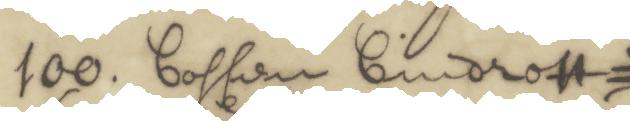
100. bossen bindrott=s
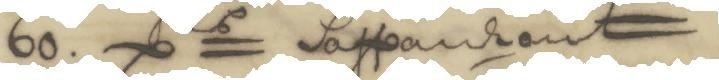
60. p=ls Sappanhout
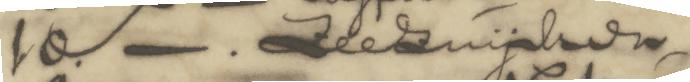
10. —. Zeezuijker
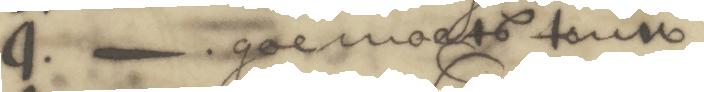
4. — . goemoets touw
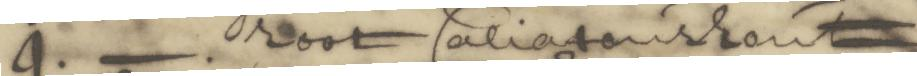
4. — . root Caliatourhout
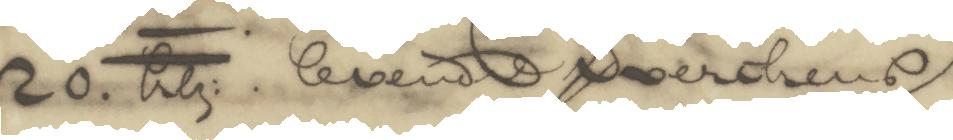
20. kln: levende ververckens
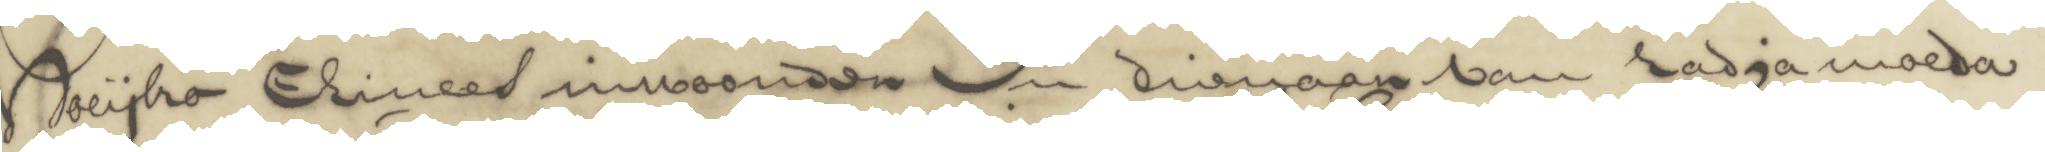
Hoeijko Chinees inwoonder En dienaar van radja moeda
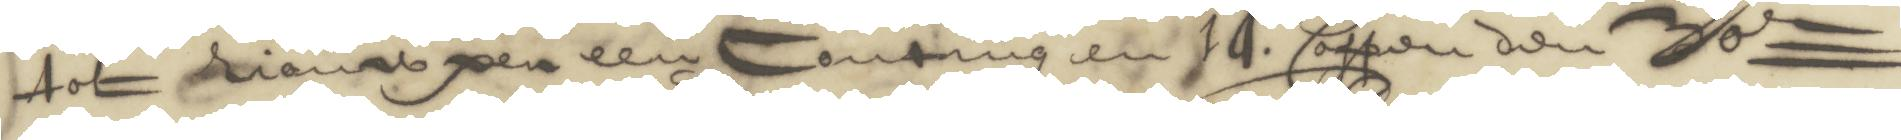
tot riouw per een Conting en 14. Coppen den 30=e
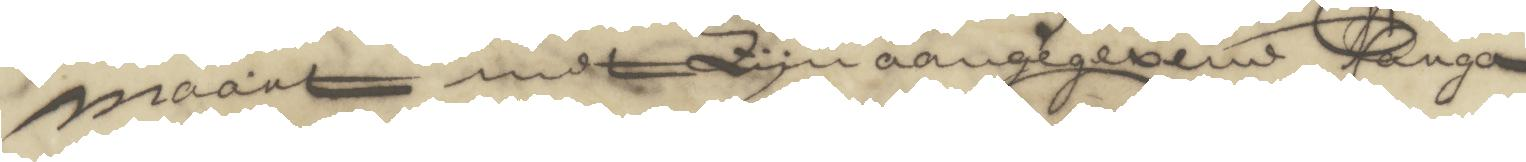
maart met Zijn aangegevene Carga
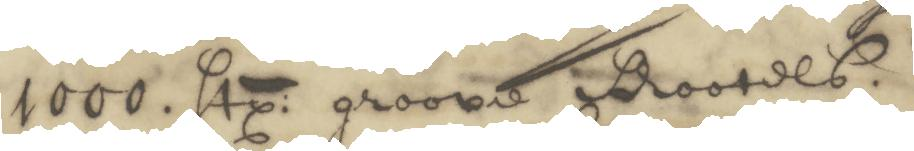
1000. stx: groove Schootels.
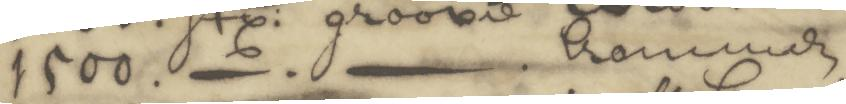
1500. — . — . kommen
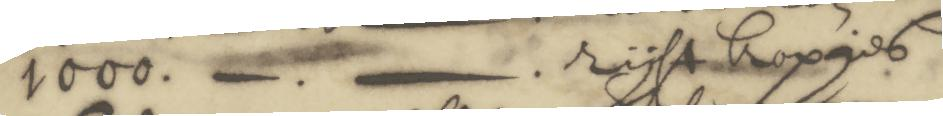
1000. —. — . rijst kopjes
